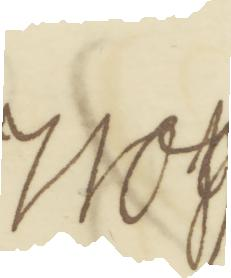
7109
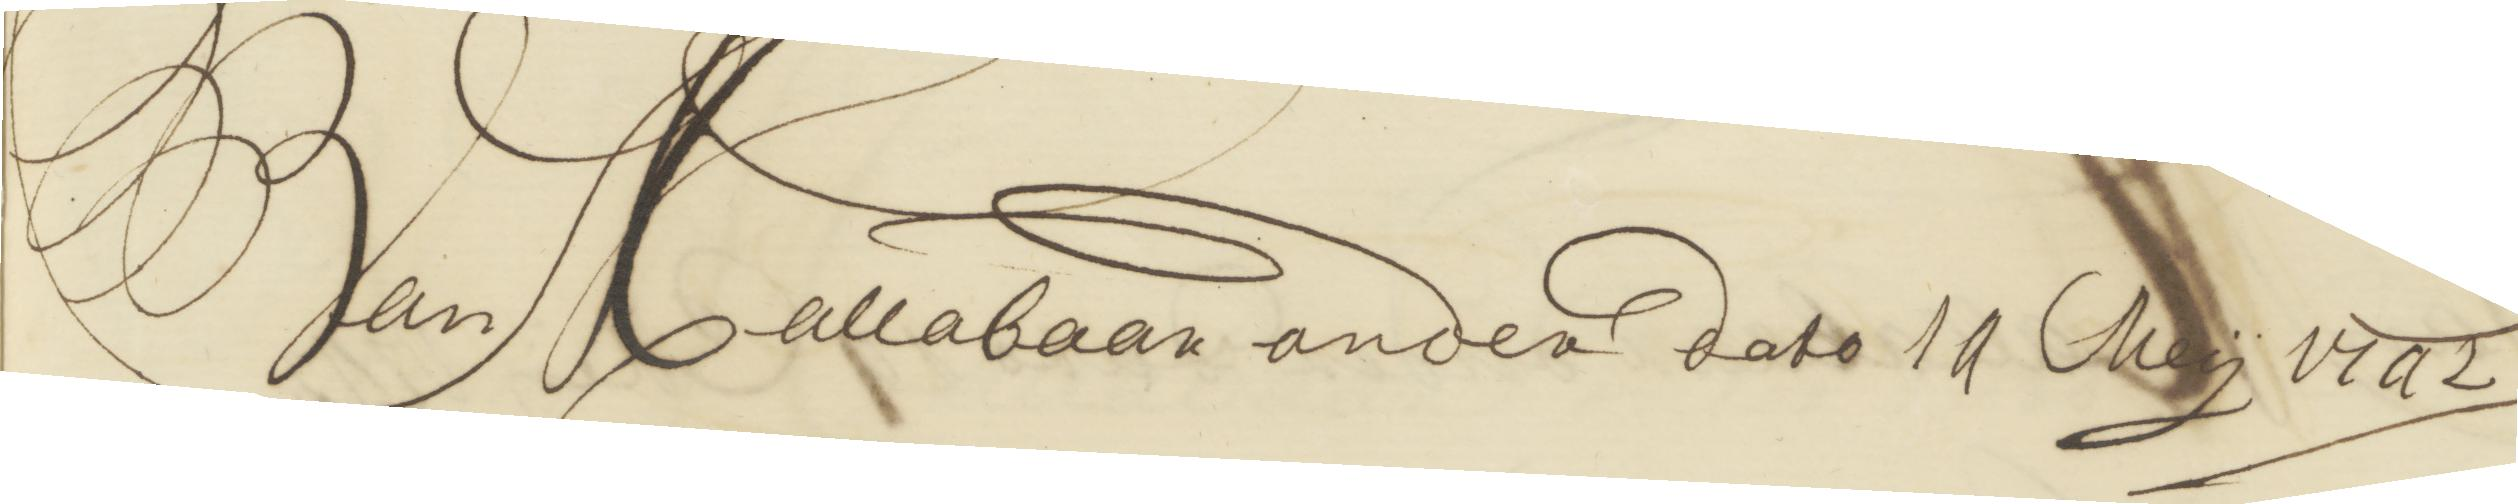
Van Mallabaar onder dato 14 Meij 1742
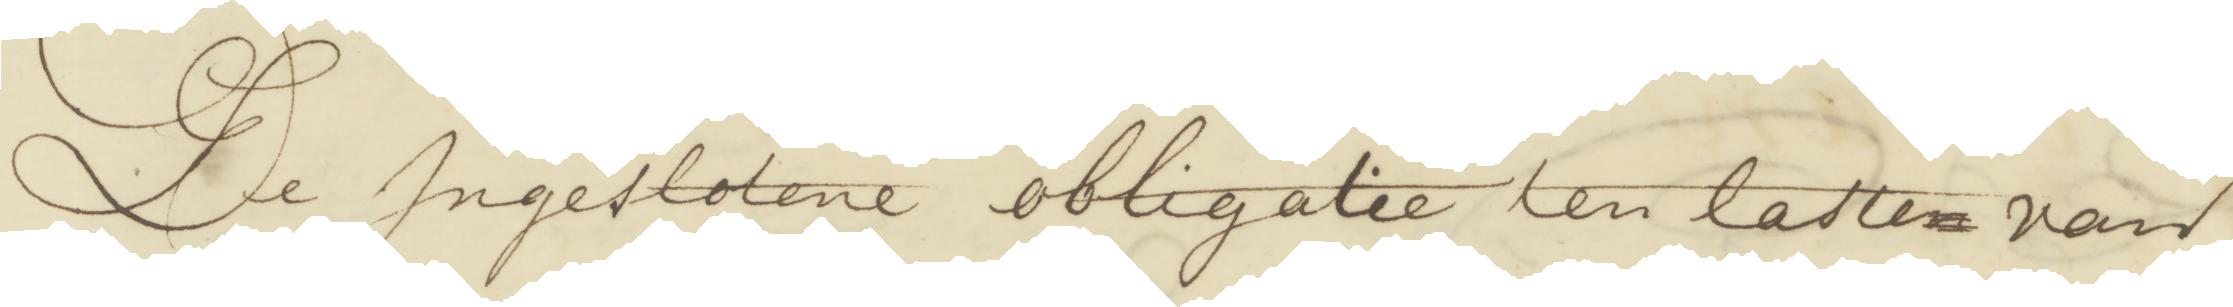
De Jngeslotene obligatie ten lasten van
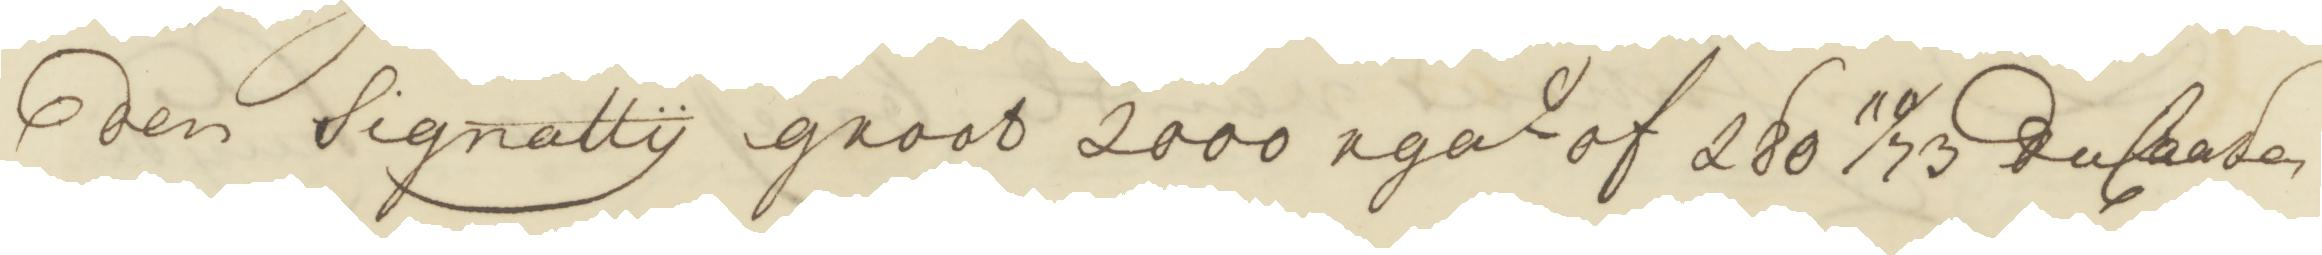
den signattij groot 2000 rga=e of 280 40/73 ducaaten
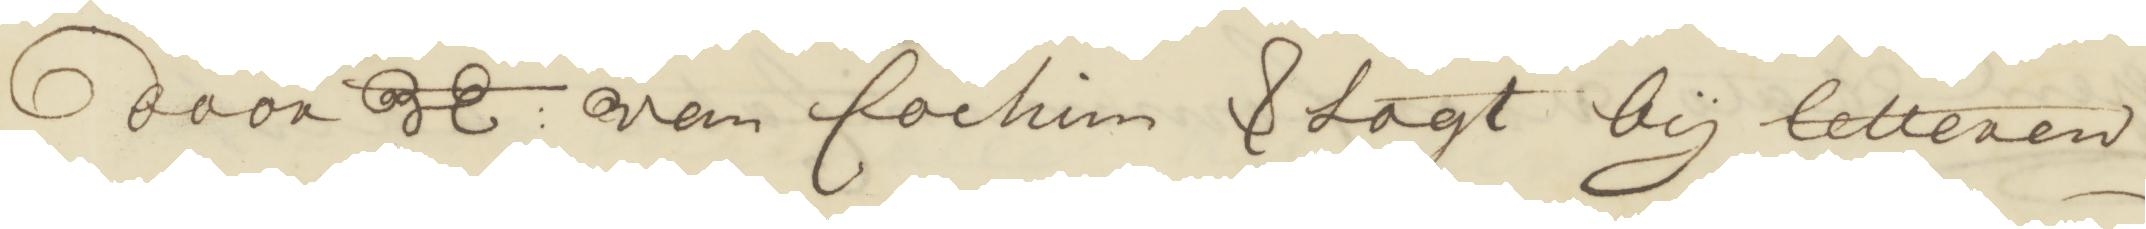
door zE: van cochim versogt bij letteren
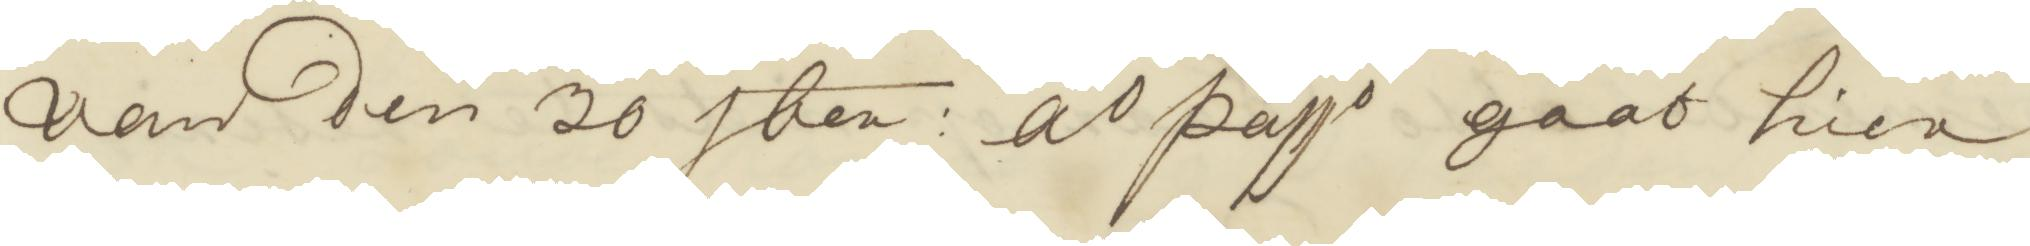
van den 30 jber: ao passo gaat hier
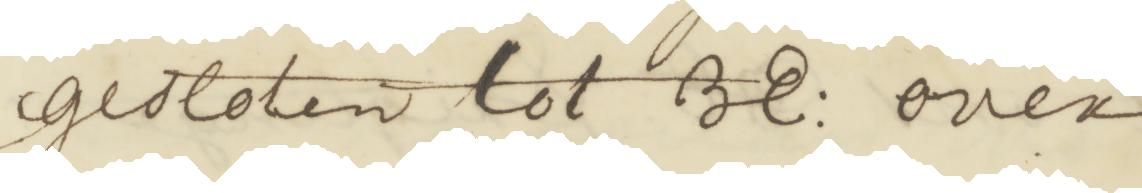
gesloten tot zE: over
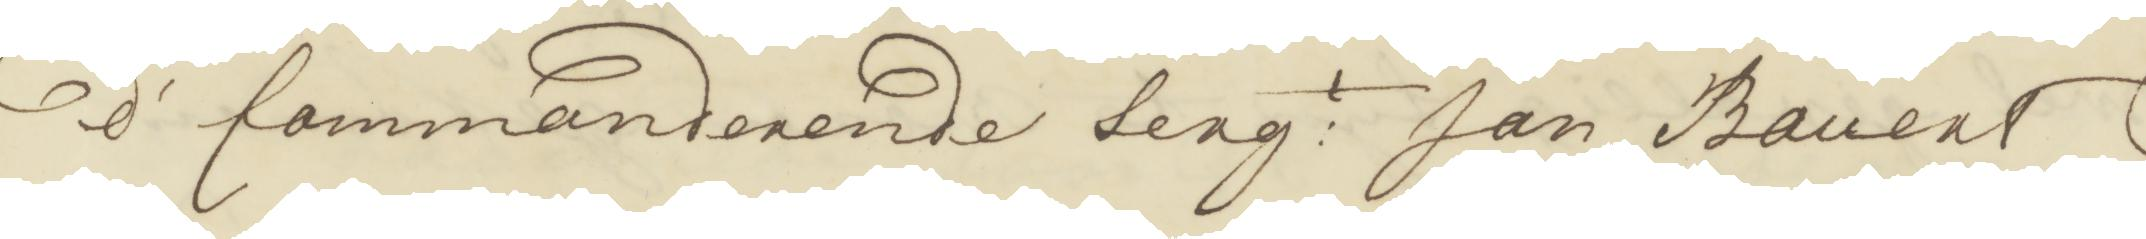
d’ Commanderende serg:t Jan Bauers
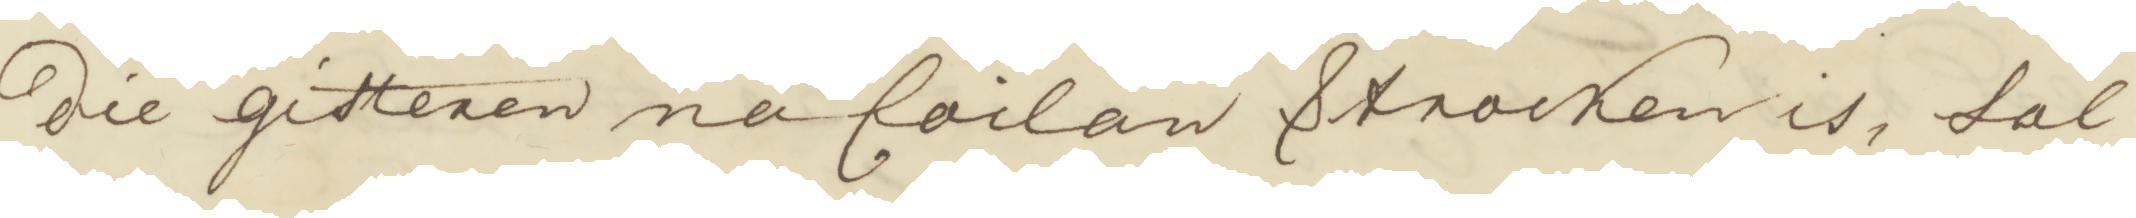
die gisteren na Coilan vertrocken is, sal
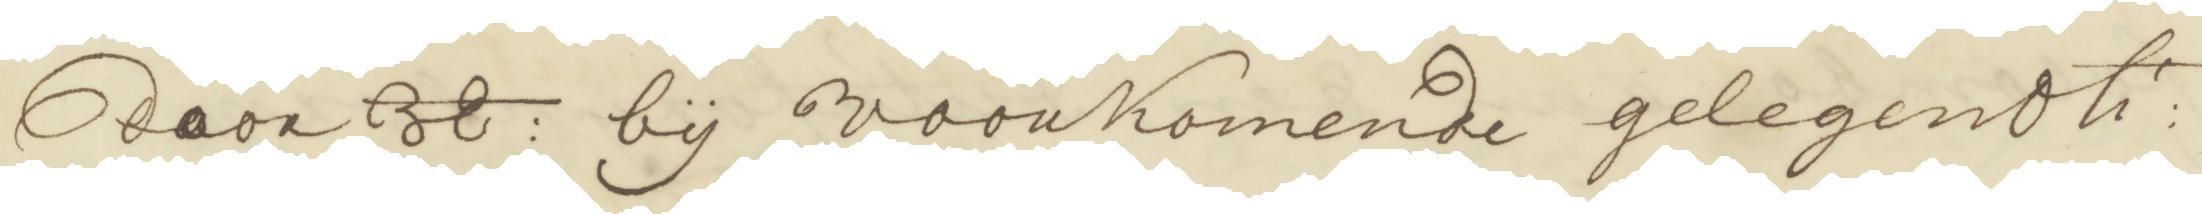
door zE: bij voorkomende gelegendh:t
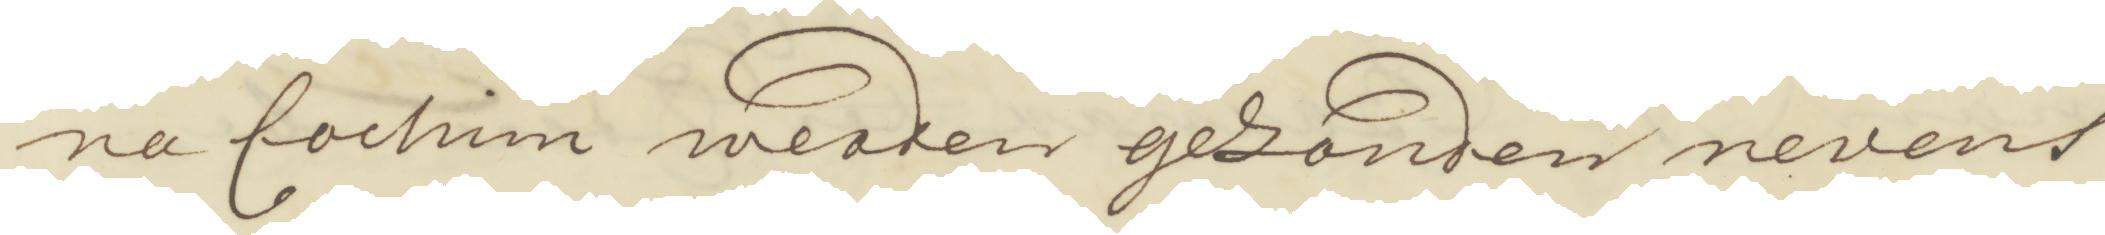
na Cochim werden gezonden nevens
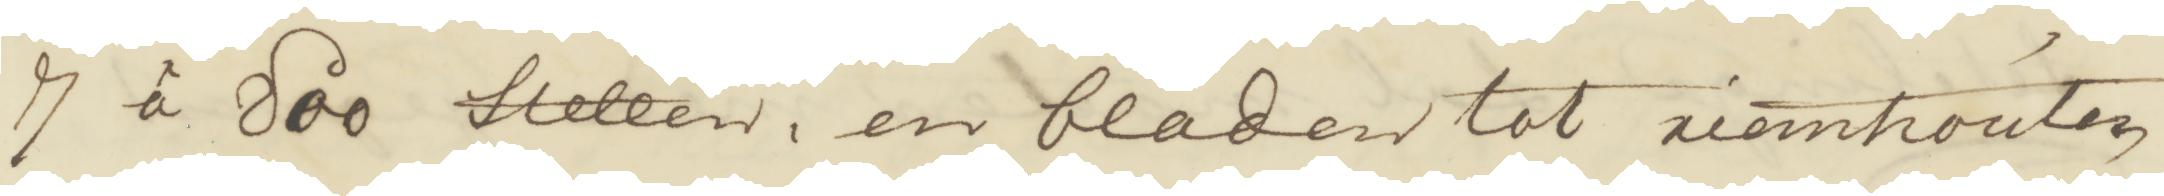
7 â 800 stellen, en bladen tot riemhouten
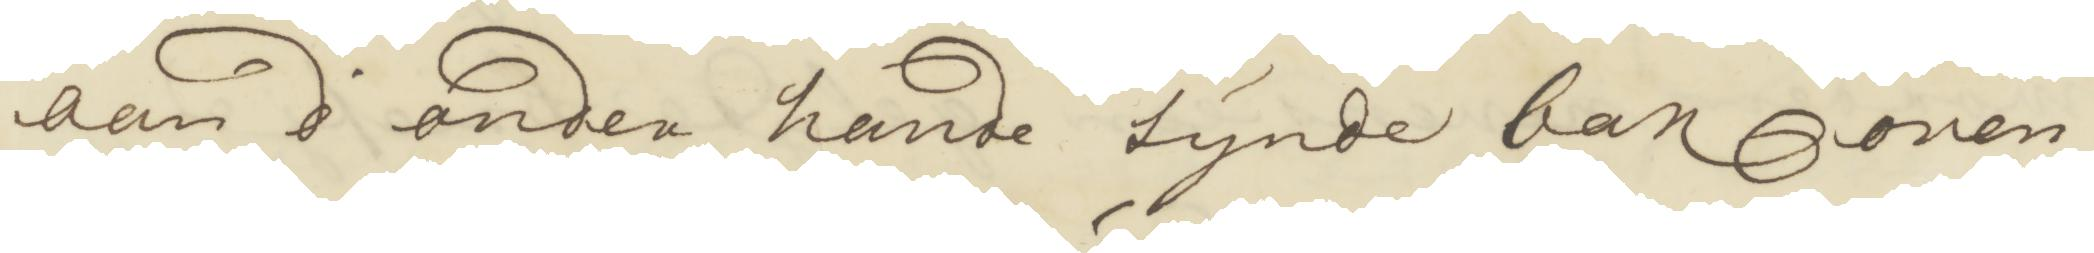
aan d’ onder hande sijnde bakoven
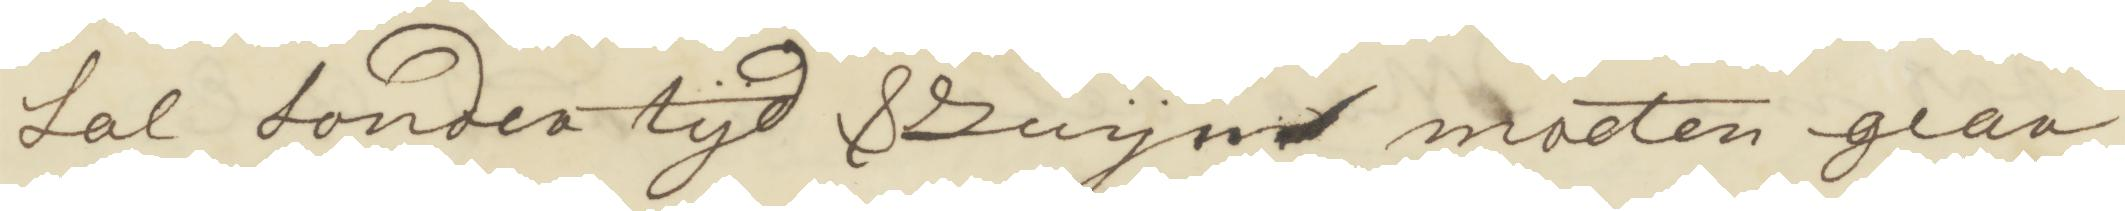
sal sonder tijd verzuijmt moeten gear
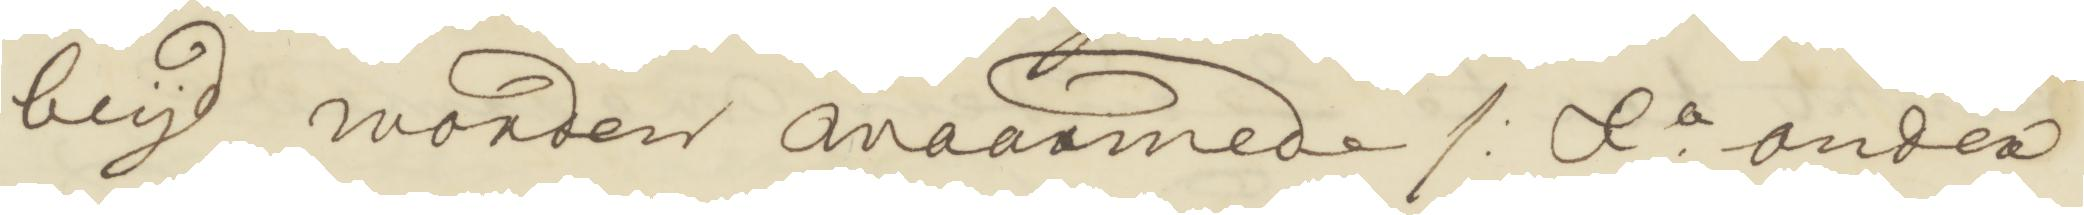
beijd worden waarmede /: &:a onder
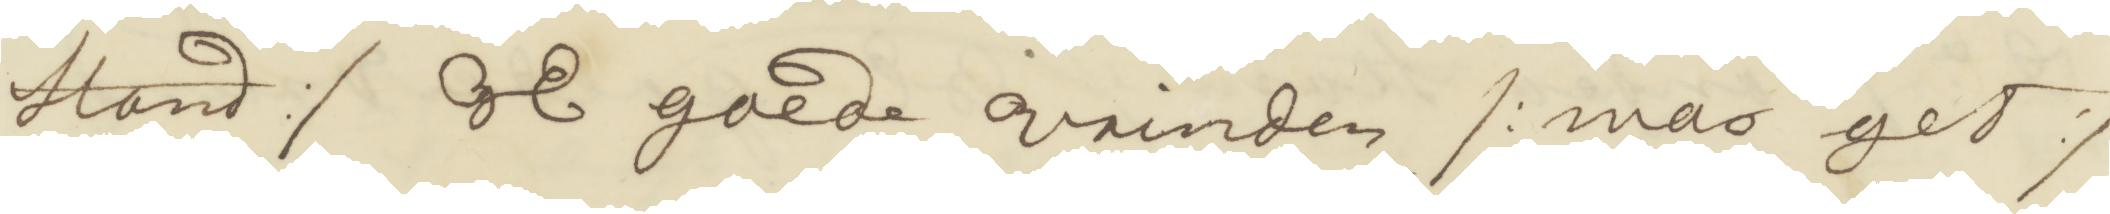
stond:/ zE goede vrinden /:was get:/
